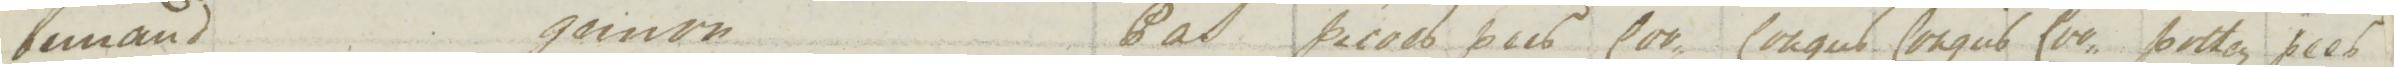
bemand gemon pas picols pees Cor„ Corgies Corgies Cor„ potten pees
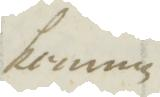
kommen
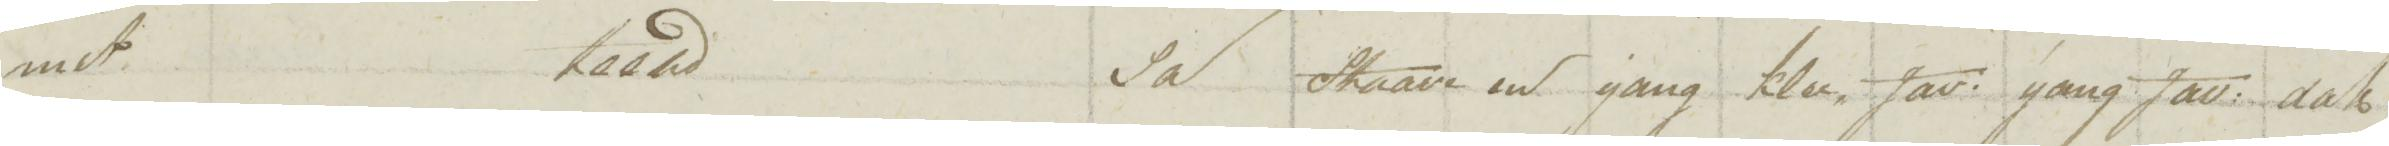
met teerd sa staave en ijang klee„ Jav. ijang Jav: dak
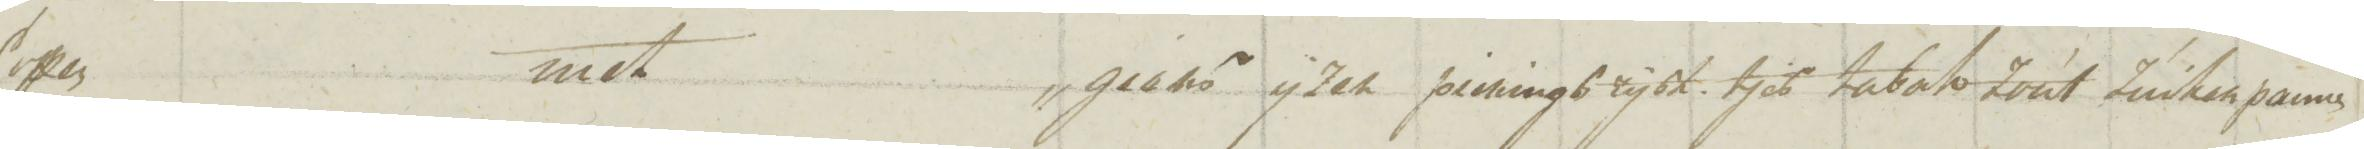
Coppen met „giers ijzer pierings rijst. tjes tabak zout Zuiker pannen
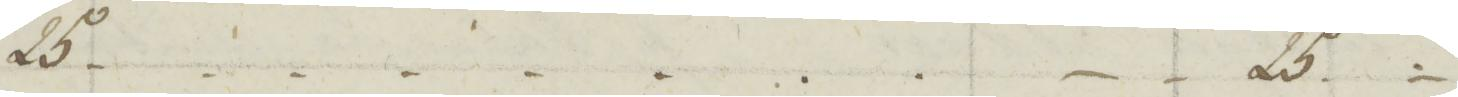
25 - - - - - - - - - — - 25. -
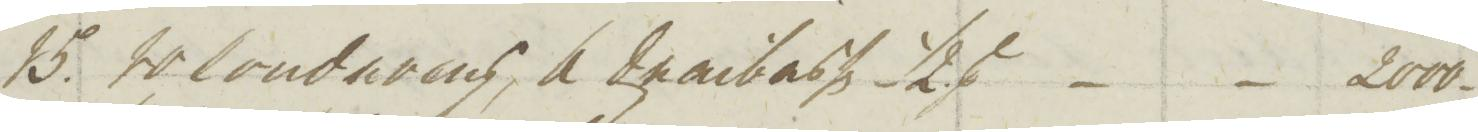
15. 10 londroers, 4 draibassen ½ p:l 2000
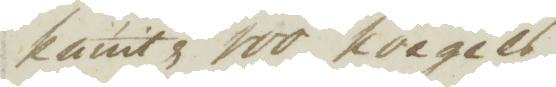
kruit & 100 koogels
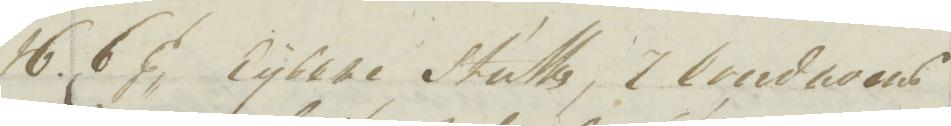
16. 6 p„s Eijsere stukken, 7 londroers
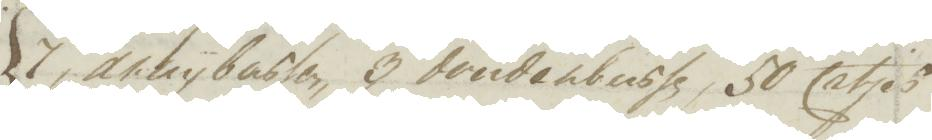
{7 „ draijbassen, 3 donderbussen, 50 Catjes
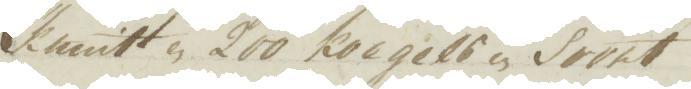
{kruit en 200 koogels in Soort
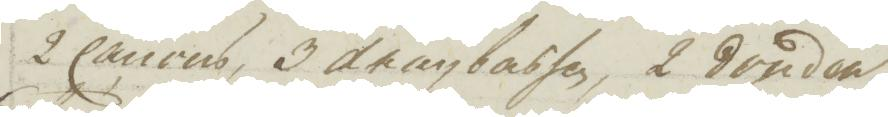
2 Canons, 3 draijbassen, 2 donder
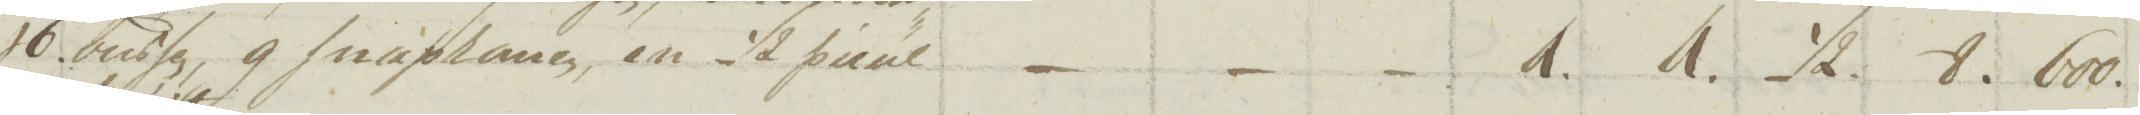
16. bussen, 9 snaphanen, en ½ picol — — — 4. 4. ½. 8. 600. —
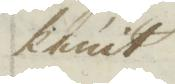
kruit
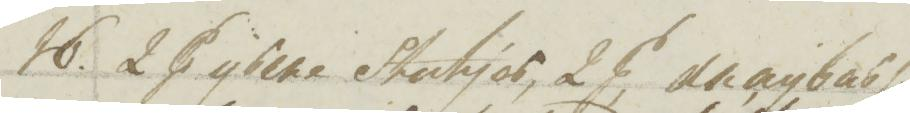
16. 2 p:s ijsere stukjes, 2 p:s draijbassen
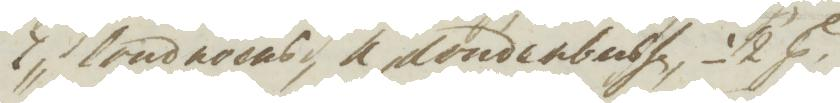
7„ londroers, 4 donderbassen, ½ p„l
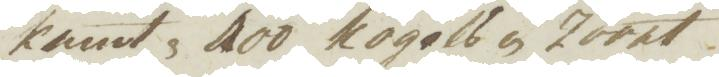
kruit en 400 kogels in Zoort
